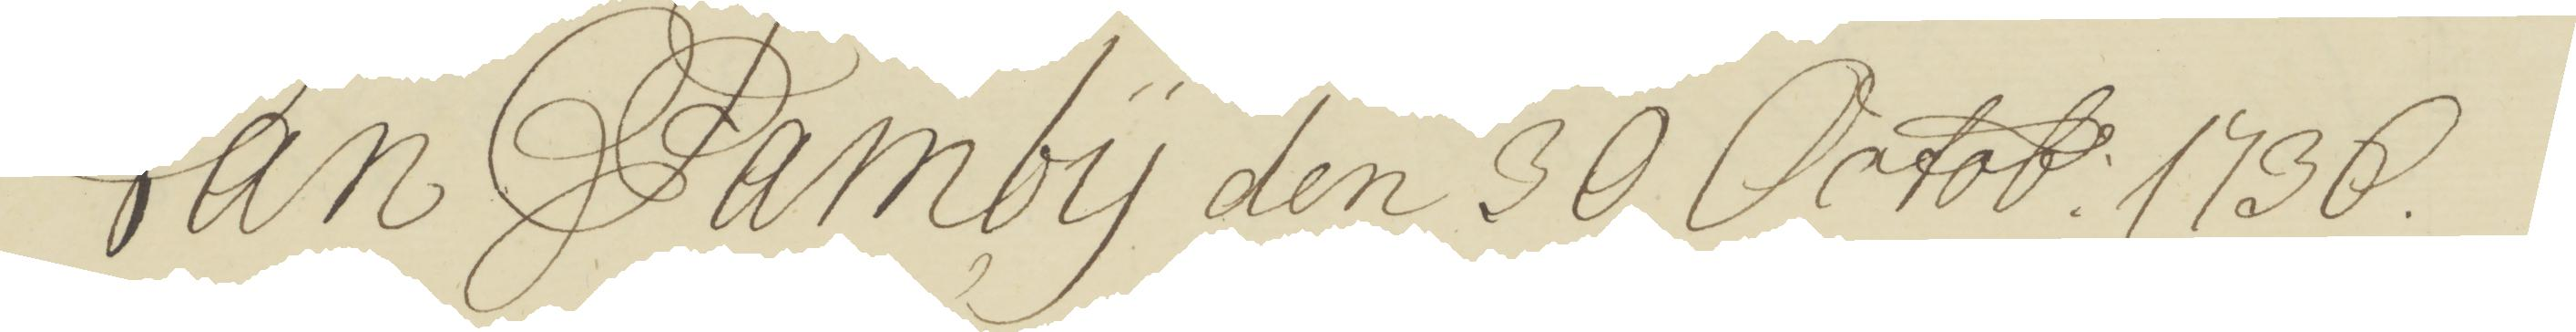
Van Iambij den 30, Octob: 1736.
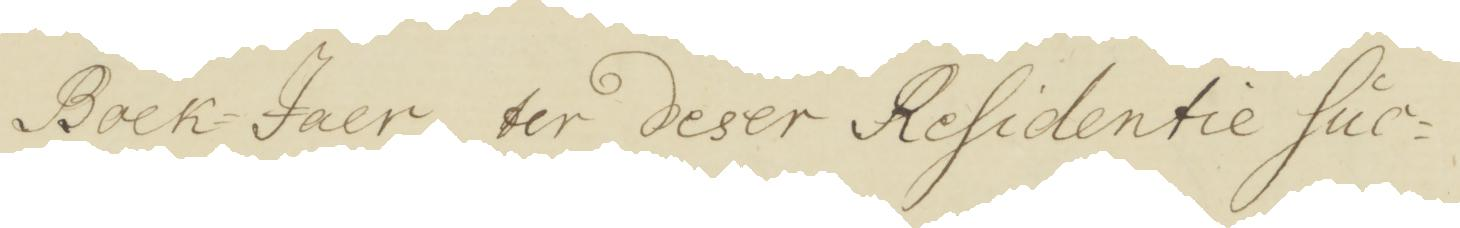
Boek=Jaer ter deser Residentie suc=
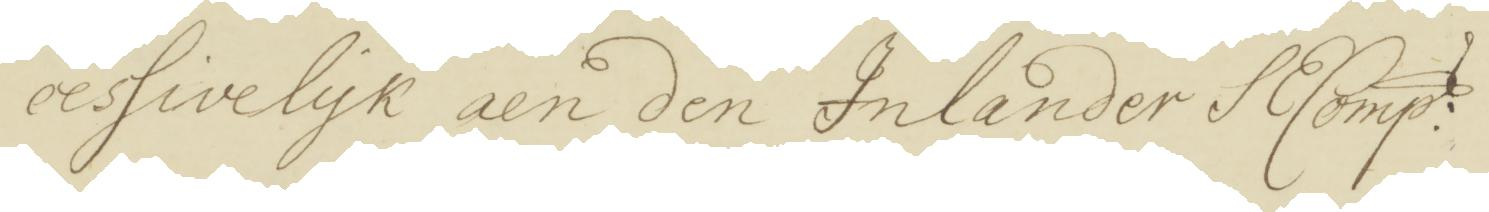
cessivelijk aen den Inlander s EComp:s
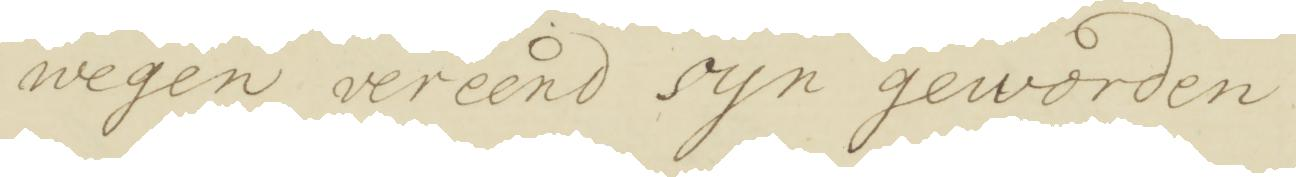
wegen vereend sijn geworden
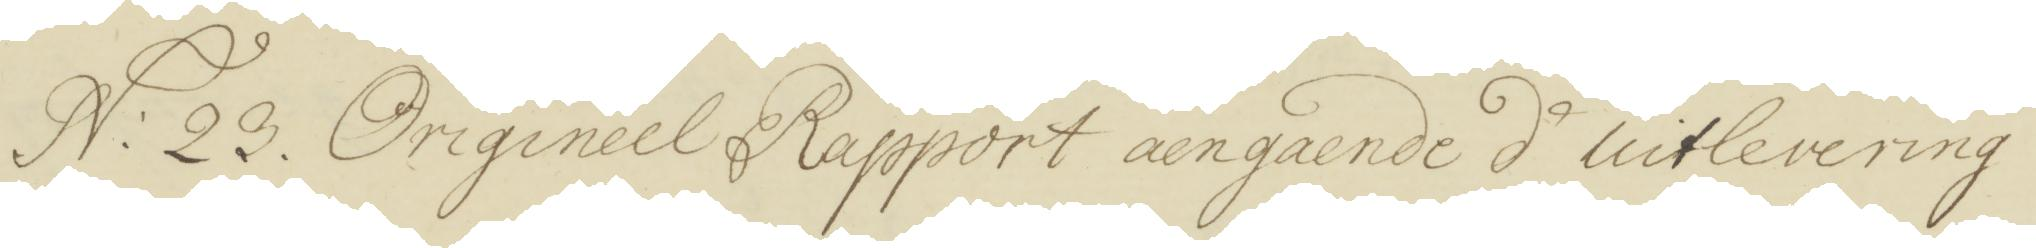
N: 23. Origineel Rapport aengaende d’uitlevering
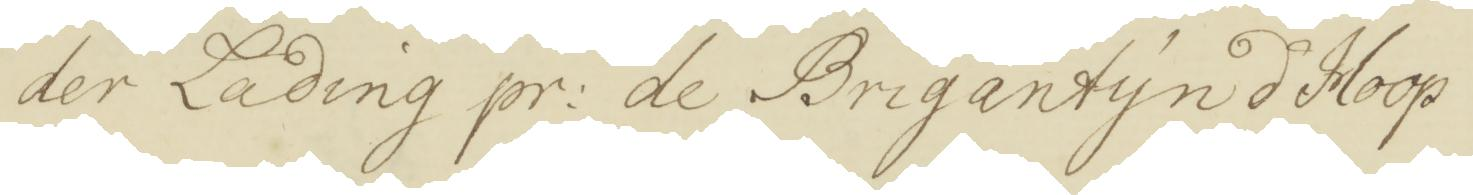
der Lading pr: de Brigantijn d’ Hoop
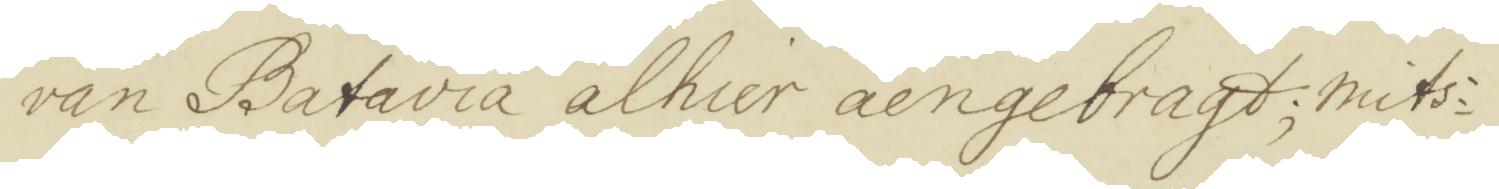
van Batavia alhier aengebragt; mits„
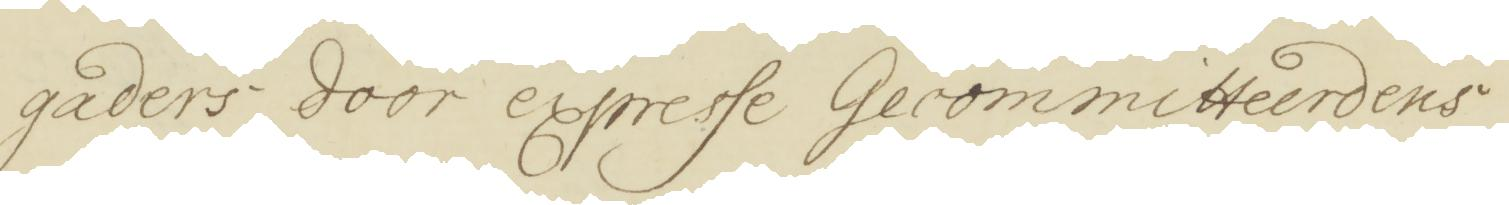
gaders door expresse Gecommitteerdens
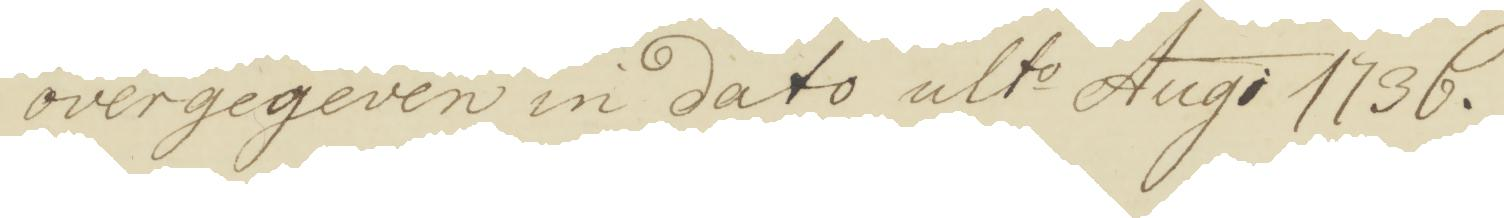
overgegeven in dato ult=o Augi 1736.
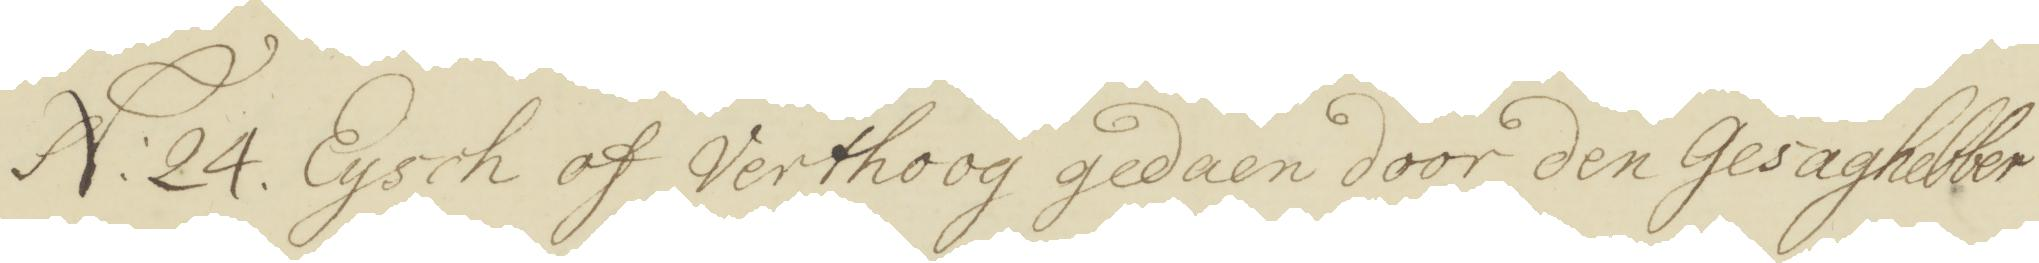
N: 24. Eysch of Verthoog gedaen door den Gesaghebber
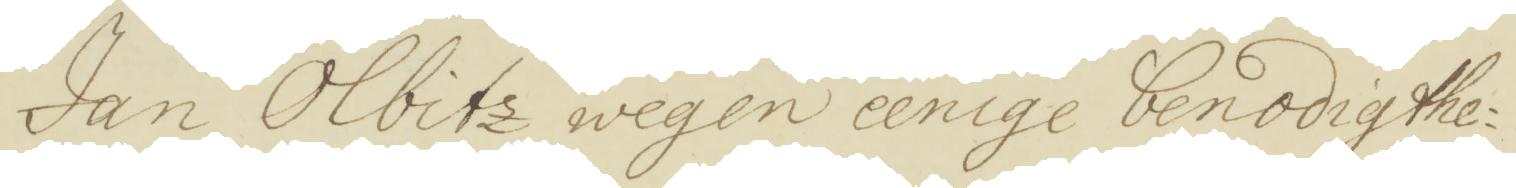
Ian Olbitz wegen eenige benodigthe„
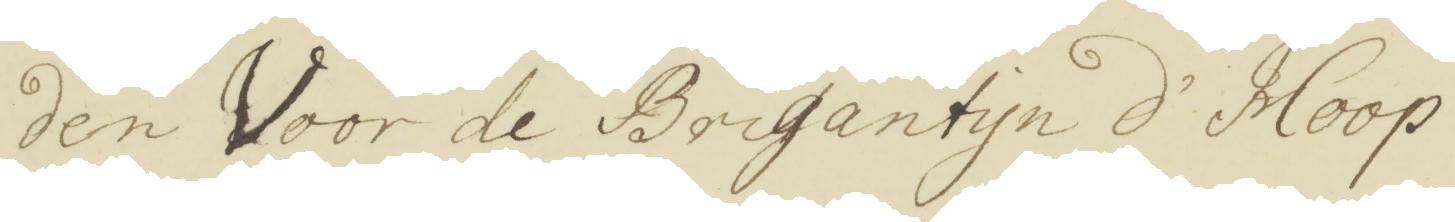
den Voor de Brigantijn d’ Hoop
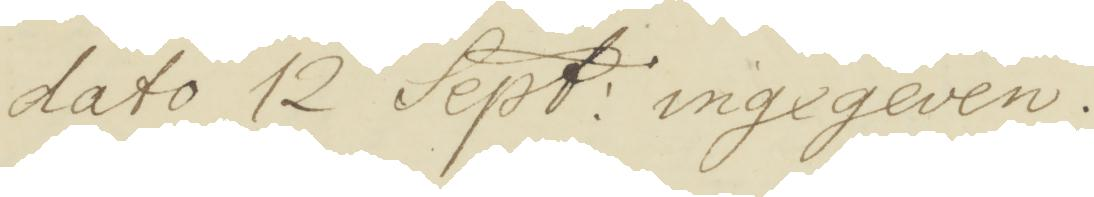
dato 12 sept: ingegeven.
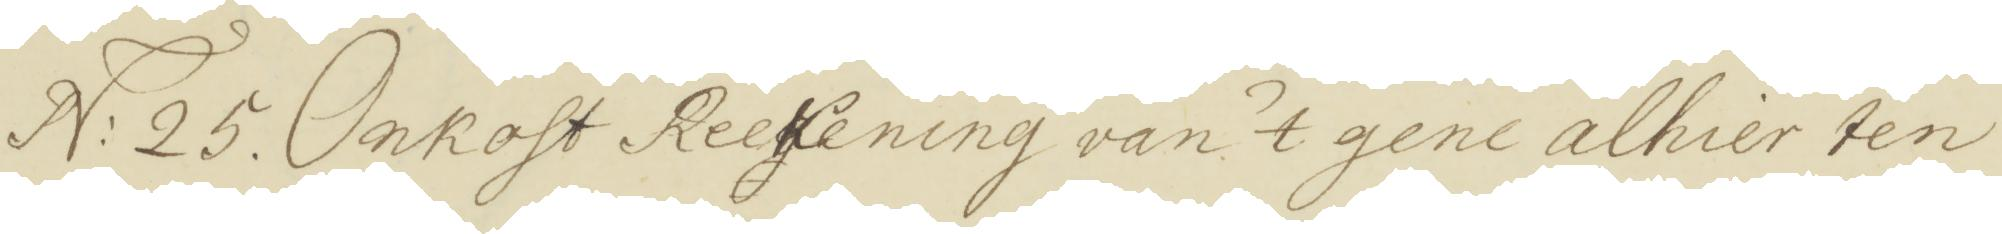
N: 25. Onkost Reekening van ’t gene alhier ten
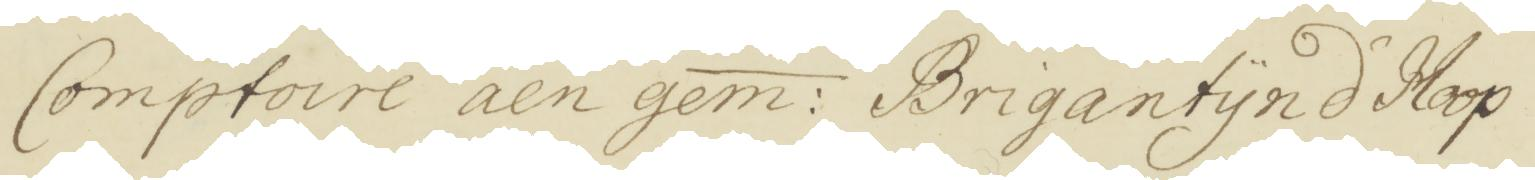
Comptoire aen gem: Brigantijn d' Hoop
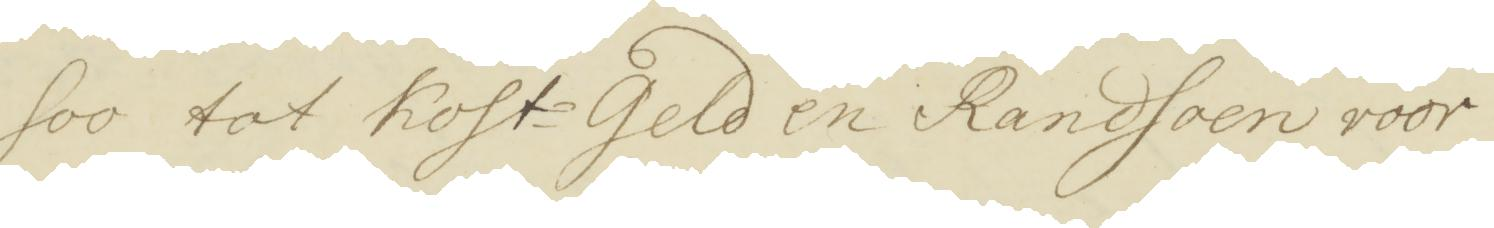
soo tot kost=Geld en Randsoen voor
